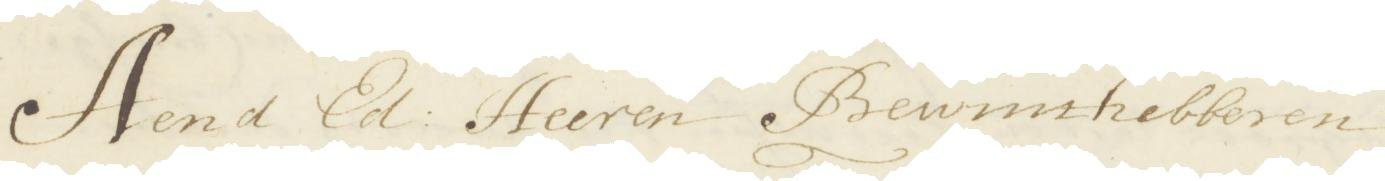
Aen d Ed: Heeren Bewinthebberen
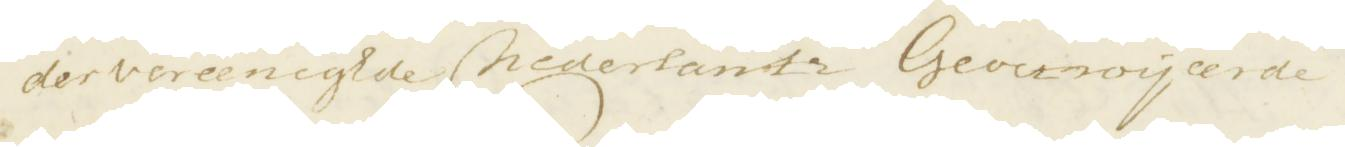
der vereenighde Nederlants Geoctroijeerde
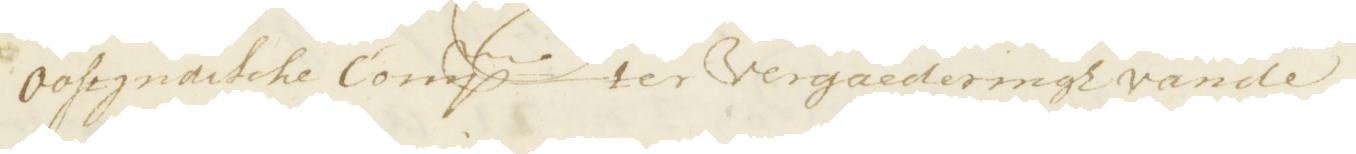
Oostindische Comp=e ter Vergaederingh vande
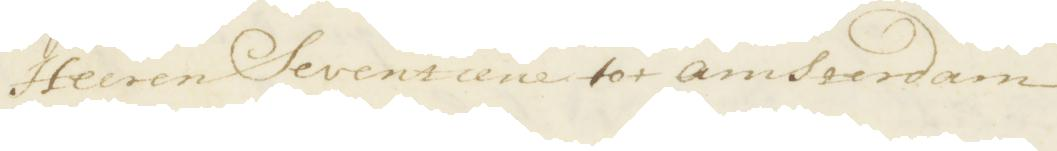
Heeren Seventiene tot Amsterdam
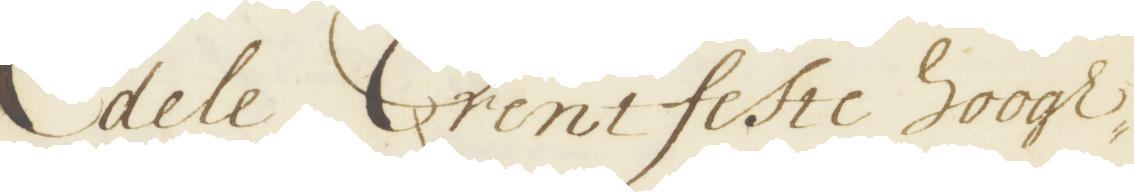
Edele Erent feste Hoogh„
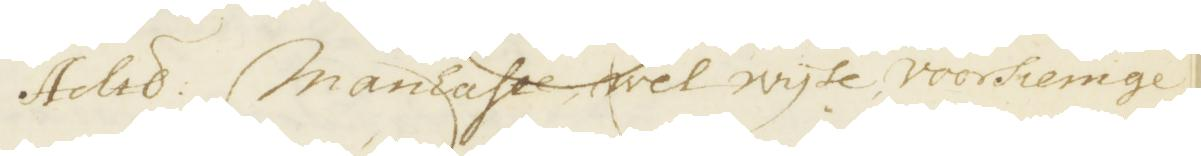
Achtd: Manhasoe wel wijse, voorsienige
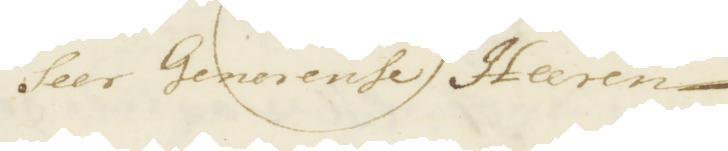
seer Genereuse Heeren
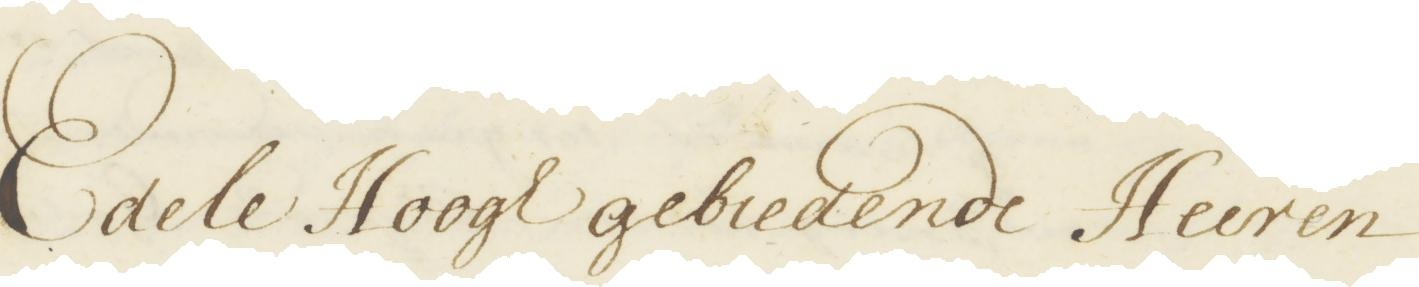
Edele Hoogh gebiedende Heeren
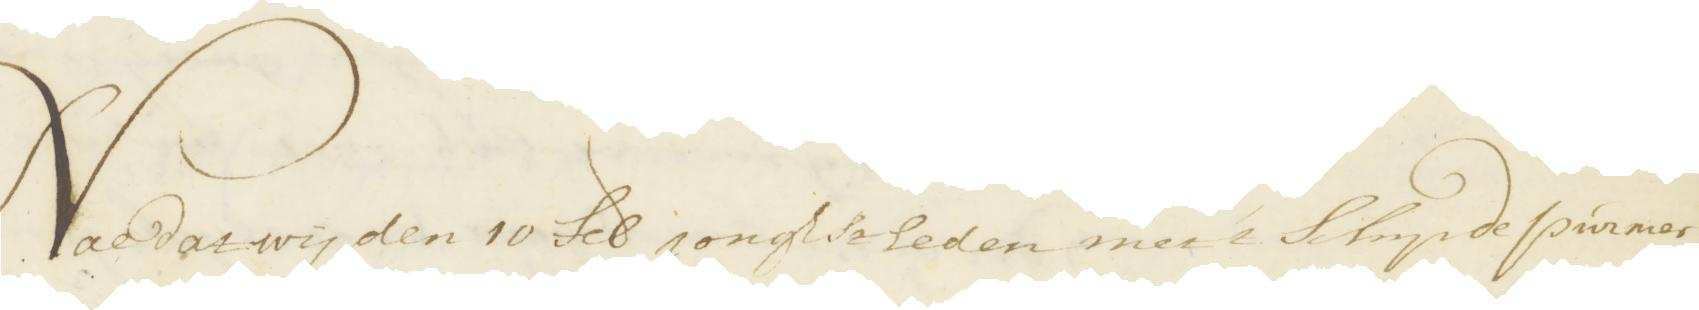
Nae dat wij den 10 feb jonghse leden met 't schip de purmer
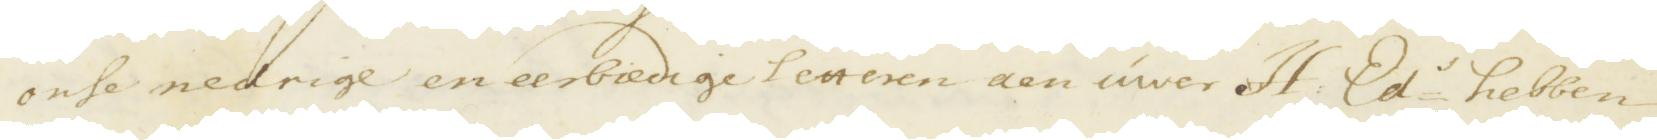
onse nedrige en eerbedige letteren aen uwer H: Ed=s hebben
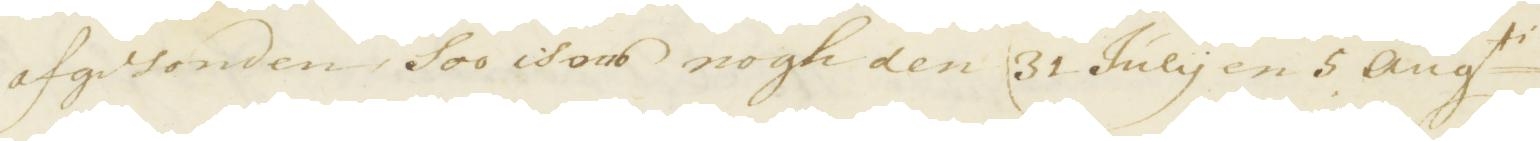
afgesonden, soo is ons nogh den 31 Julij en 5 Aug=ti
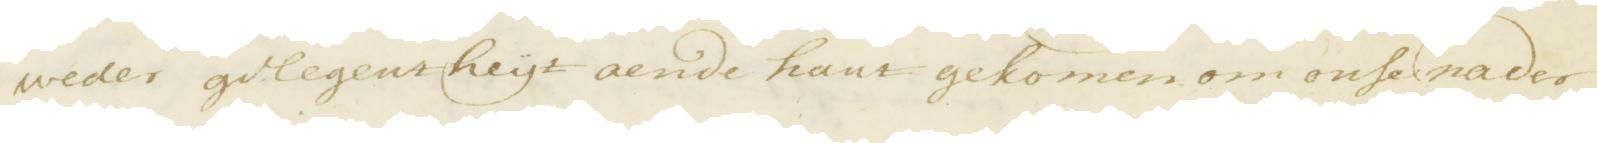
weder gelegentheijt aende hant gekomen om onse nader
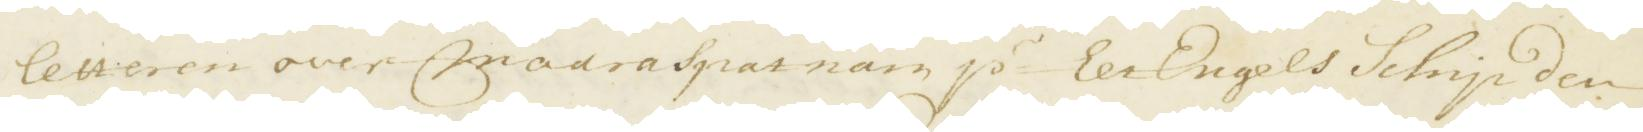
letteren over Madraspatnam p=e het Engels schip den
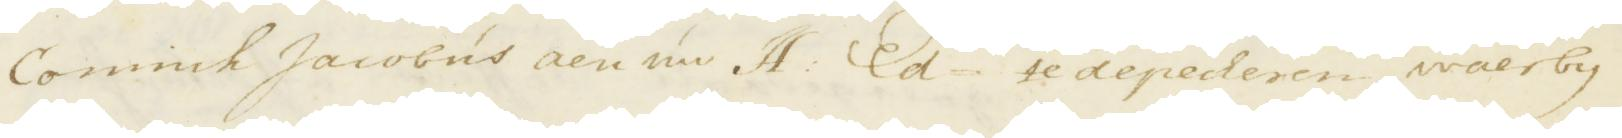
Connink Jacobus aen uw H: Ed=e te depecheren, waerbij
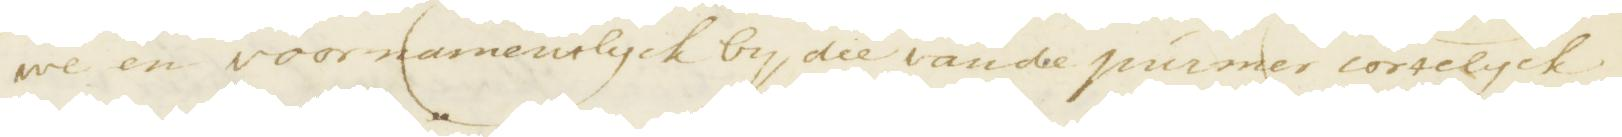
we en voornamentlijck bij die van de purmer cortelijck
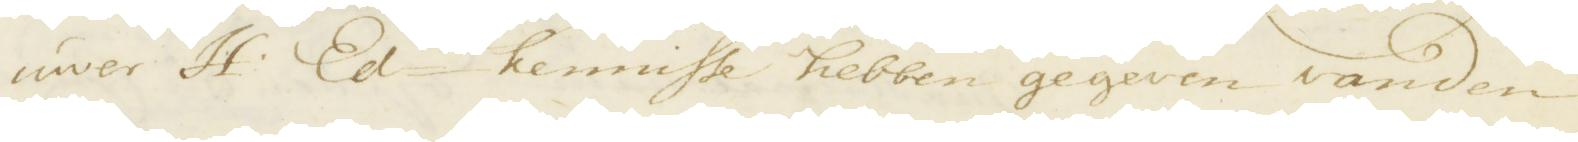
uwer H: Ed=r kennisse hebben gegeven van den
